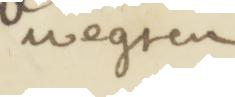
wegten
